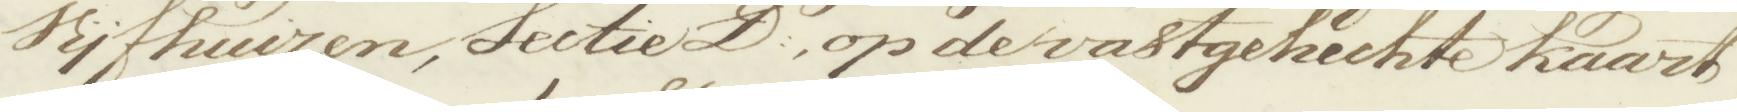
Vijfhuizen, sectie D:, op de vastgehechte kaart
